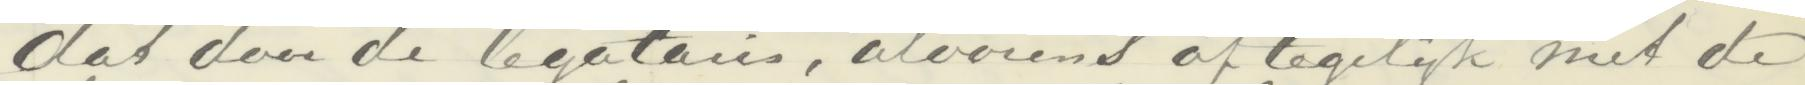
dat door de legataris, alvorens of tegelijk met de
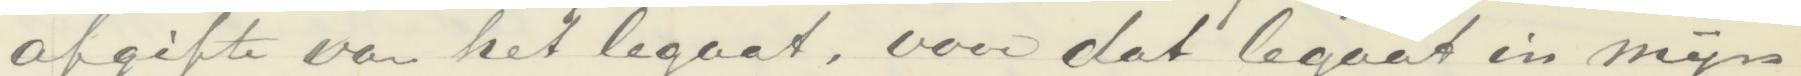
afgifte van het legaat, voor dat legaat in mijn
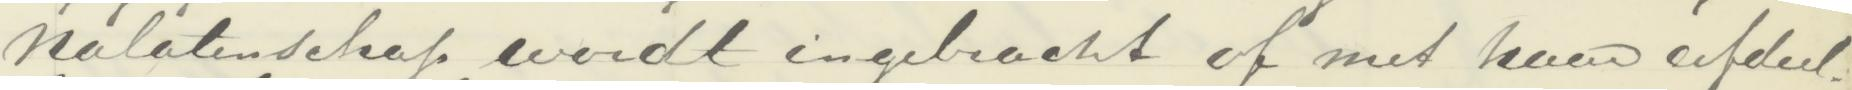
nalatenschap wordt ingebracht of met haar erfdeel-
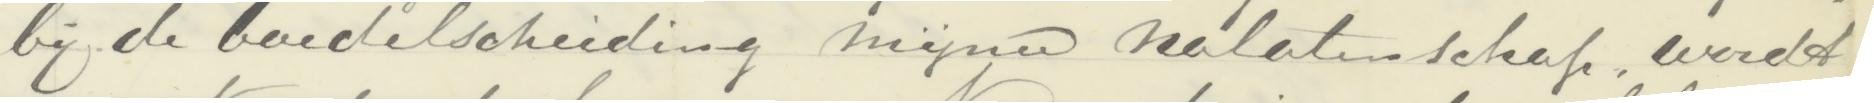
bij de boedelscheiding mijner nalatenschap, wordt
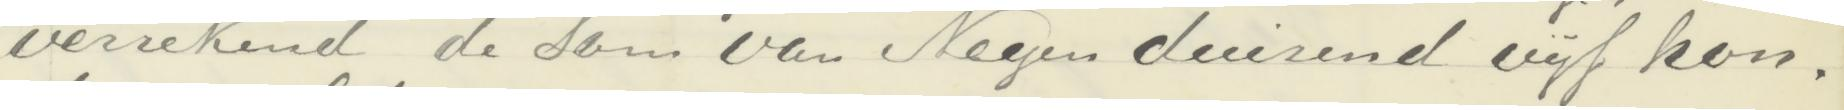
verrekend de som van Negen duizend vijf hon,
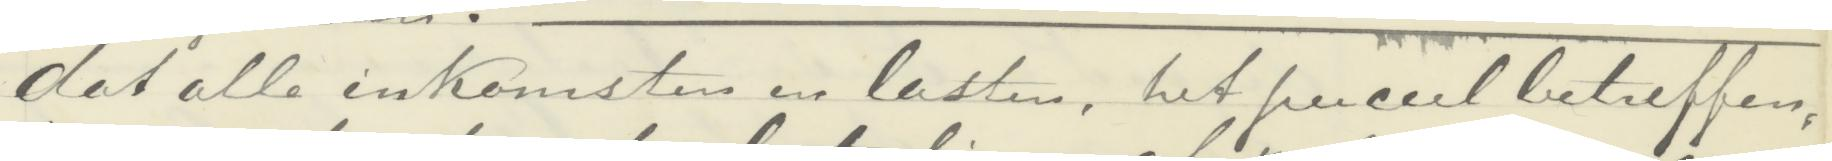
det alle inkomsten en lasten, het perceel betreffen=
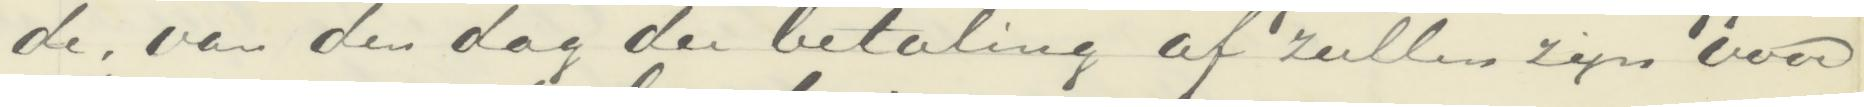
de, van den dag der betaling af zullen zijn voor
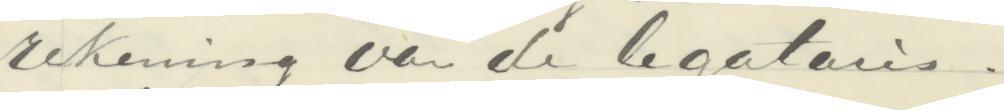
rekening van de legataris.
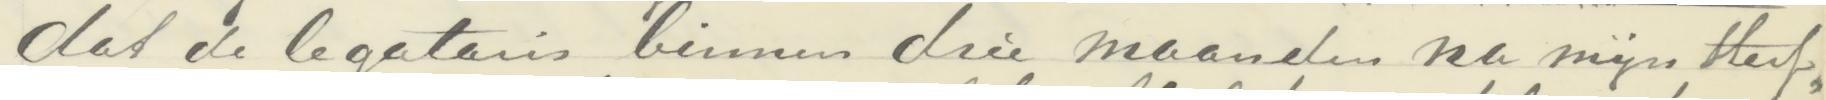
dat de legataris binnen drie maanden na mijn sterf
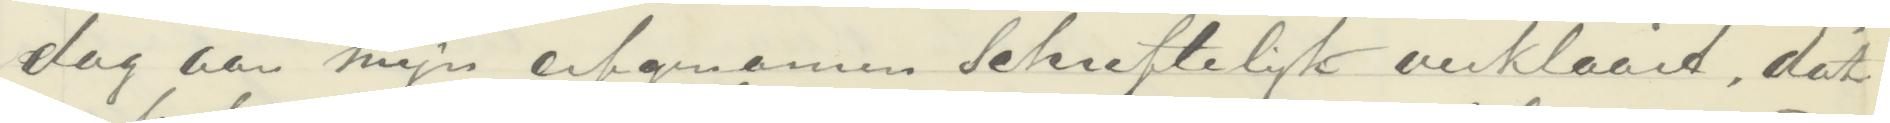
dag aan mijn erfgenamen schriftelijk verklaart, dat
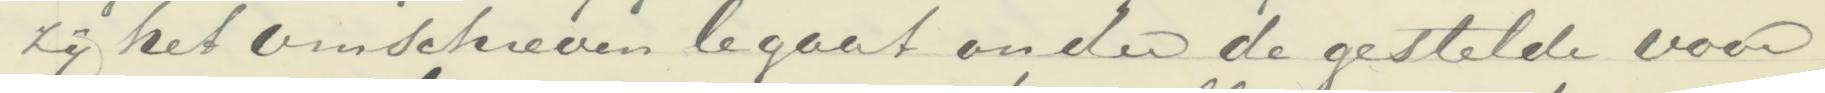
zij het omschreven legaat onder de gestelde voor
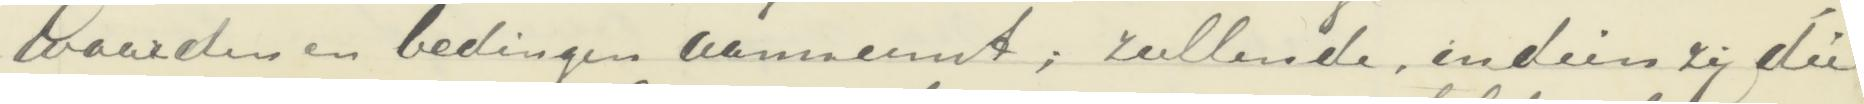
waarden en bedingen aanneemt; zullende, in dien zij die
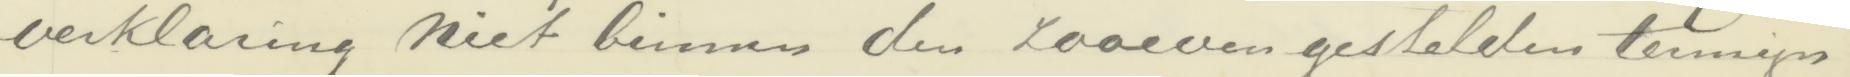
verklaring niet binnen den zooeven gestelden termijn
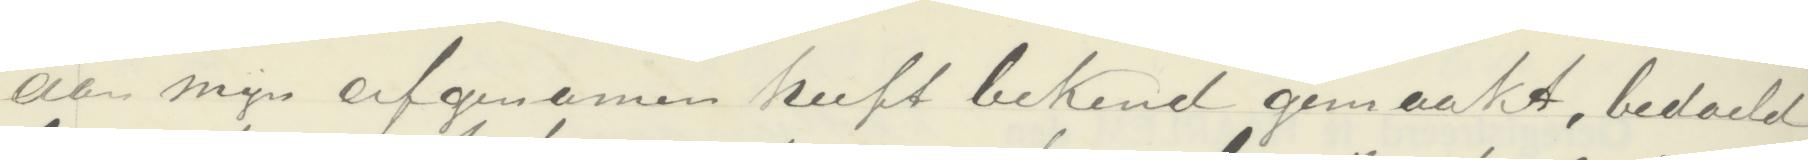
aan mijn erfgenamen heeft bekend gemaakt, bedoeld
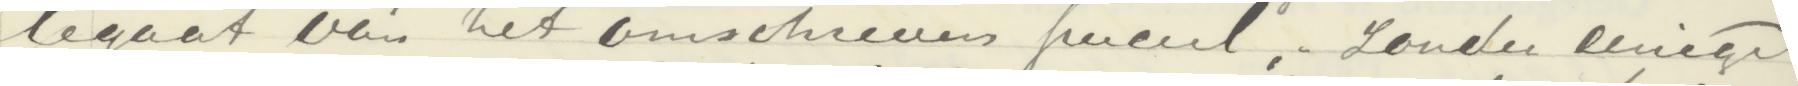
legaat van het omschreven perceel, zonder eenige
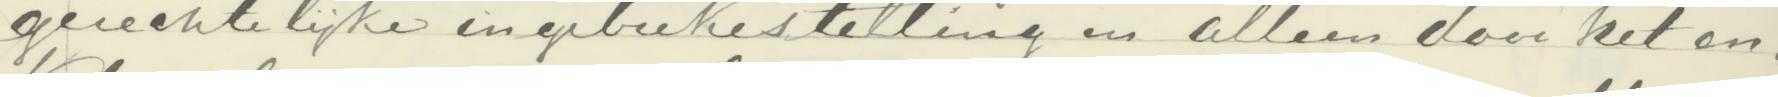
gerechtelijke ingebrekestelling en alleen door het en
